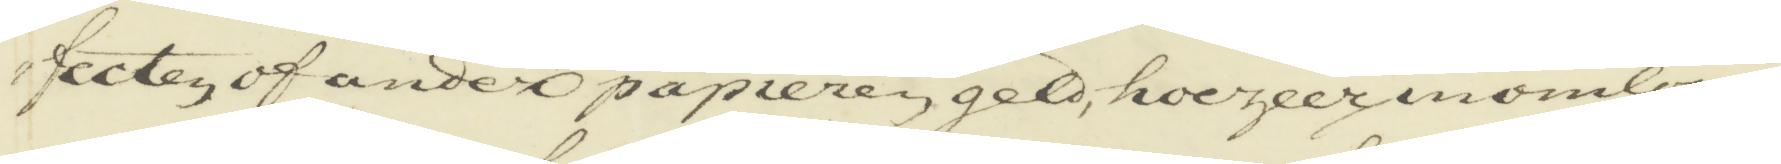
„fecten of ander papieren geld, hoe zeer in omloop
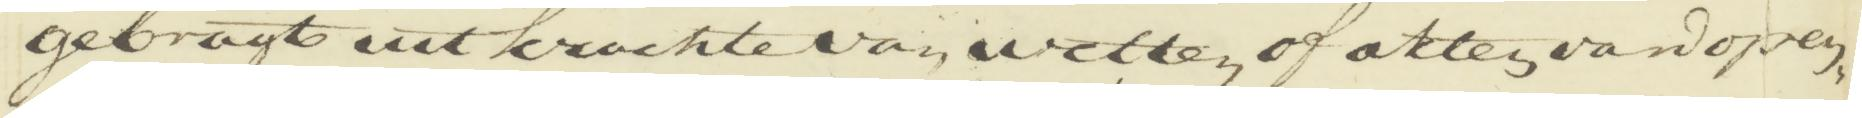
gebragt uit krachte van wetten of akten van open„
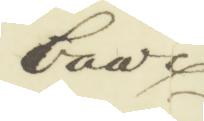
baar
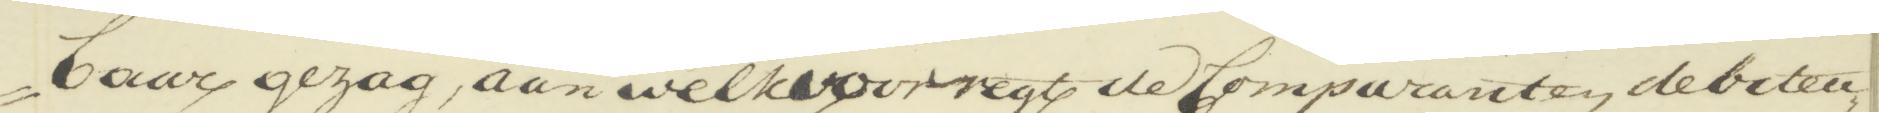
„baar gezag, aan welke voorregt de Comparanten debiteu„
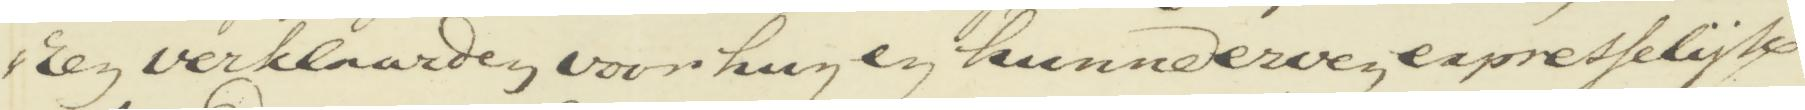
„ren verklaarden voor hun en hunne erven expresselijk
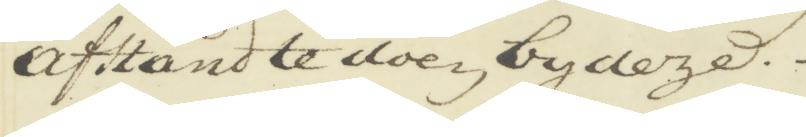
afstand te doen by deze.
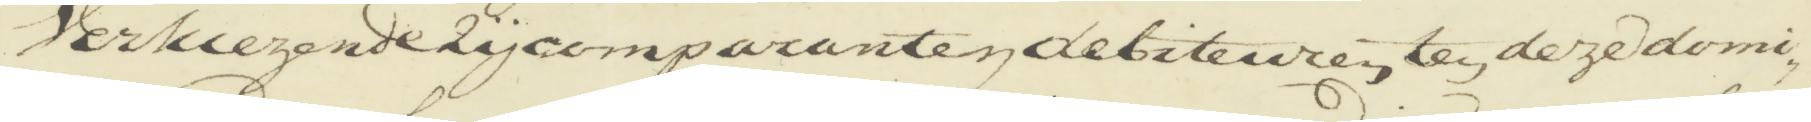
Verkiezende zij comparanten debiteuren ten deze domi„
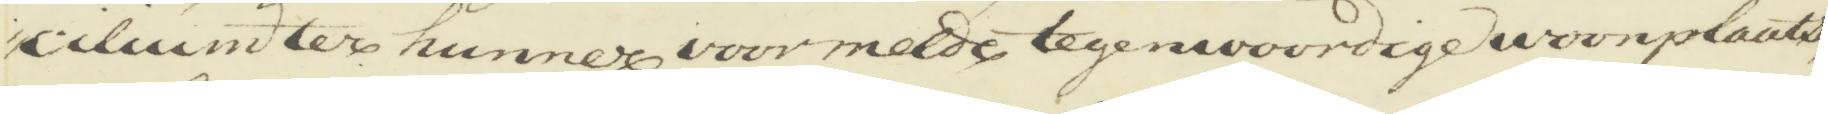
„cilium ter hunner voormelde tegenwoordige woonplaats,
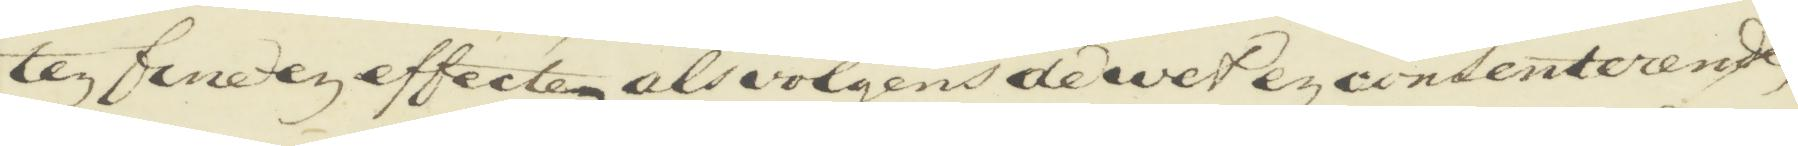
ten fine en effecten als volgens de wet en consenterende,
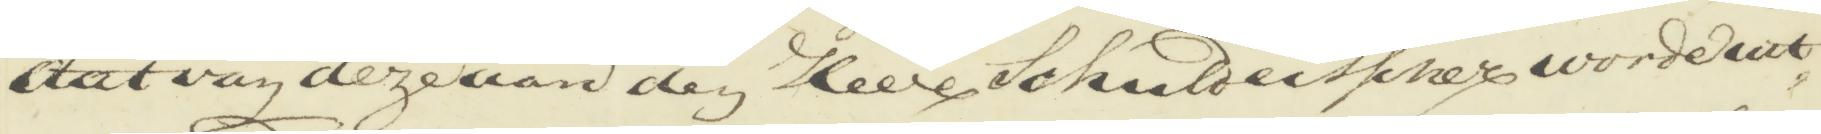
dat van deze aan den Heere Schuldeisscher worde uit„
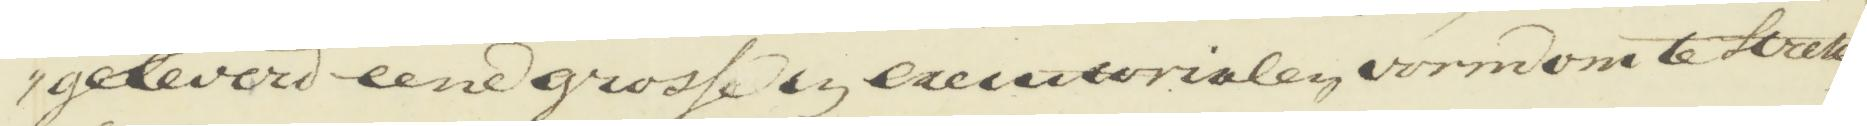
„geleverd eene grosse in executorialen vormo om te strek
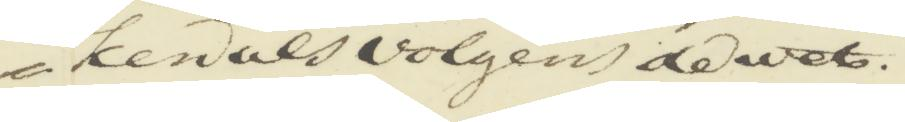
=ken als volgens de wet.
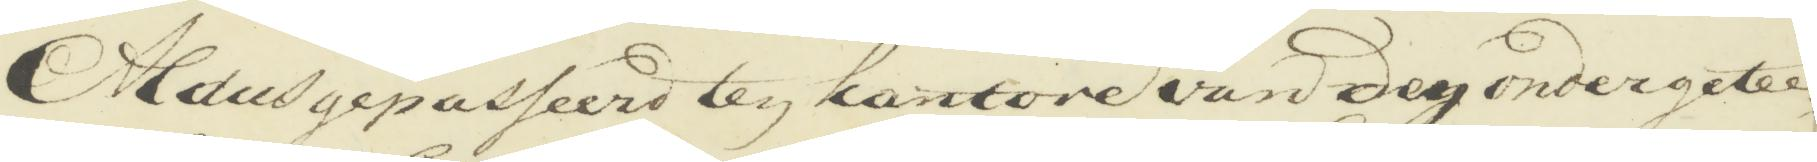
Aldus gepasseerd ten kantore van den ondergetee
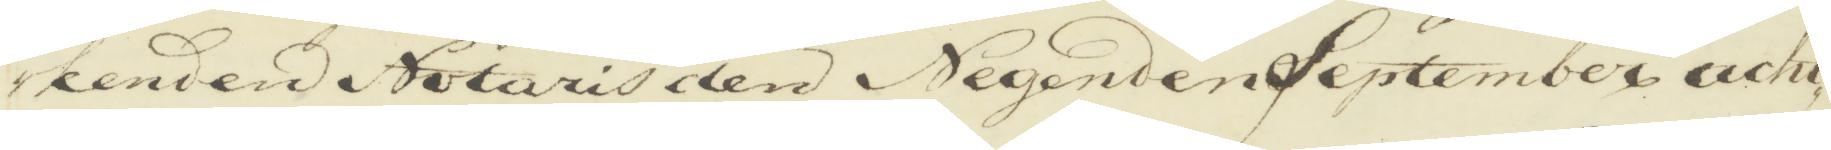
„kenden Notaris den Negenden September acht
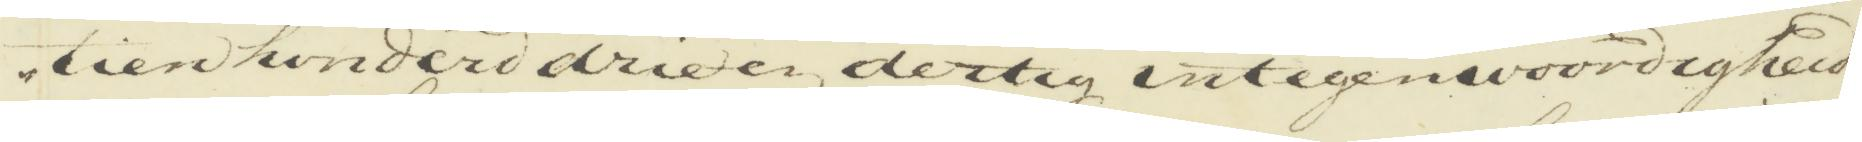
„tien honderd drie en dertig integenwoordigheid
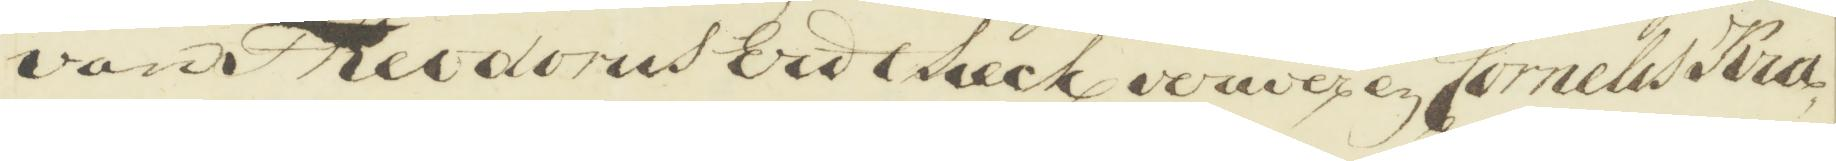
van Theodorus Erdtsieck verwer en Cornelis Kra„
